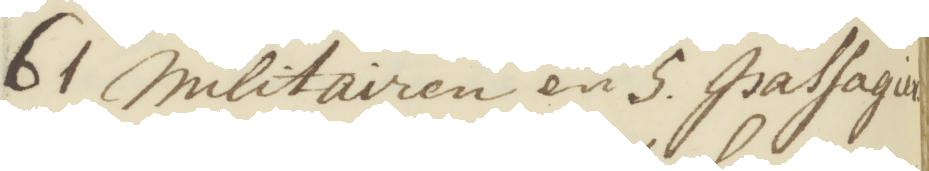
61 militairen en 5. passagier
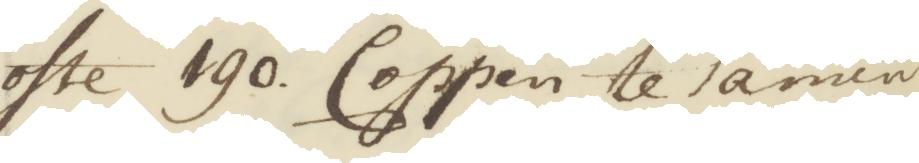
ofte 190. Coppen te samen
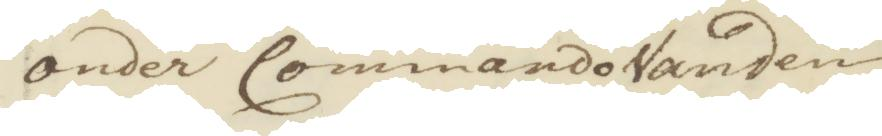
onder Commando van den
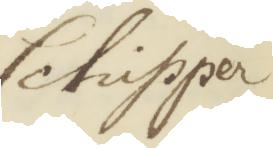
schipper
